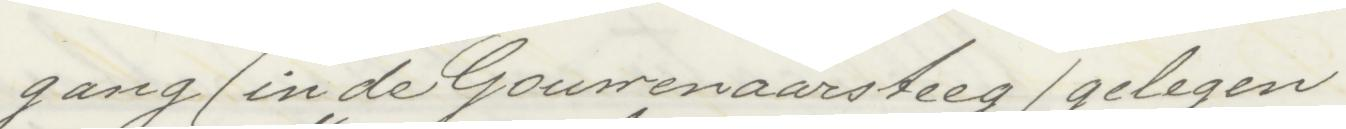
gang (in de Gouwenaarsteeg) gelegen
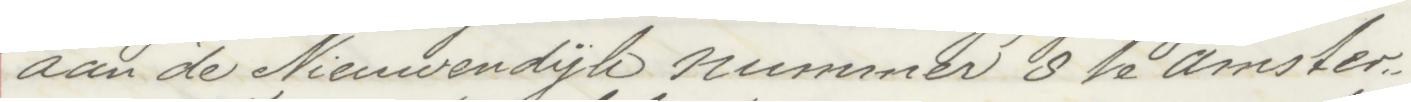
aan de Nieuwendijk nummer 8 te Amster„
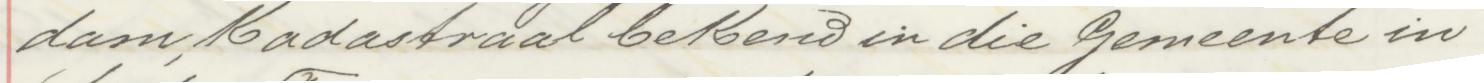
dam, kadastraal bekend in die Gemeente in
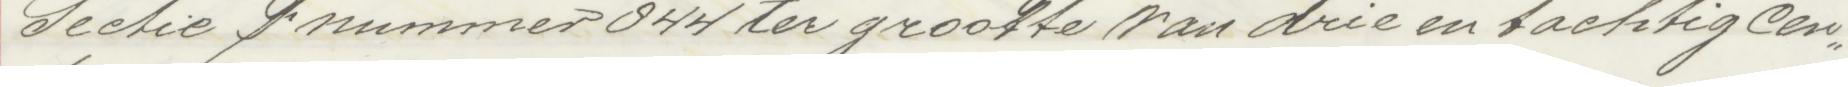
sectie F nummer 844 ter grootte van drie en tachtig cen„
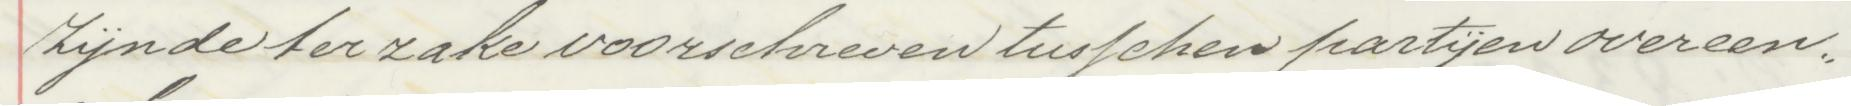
Zijnde ter zake voorschreven tusschen partijen overeen„
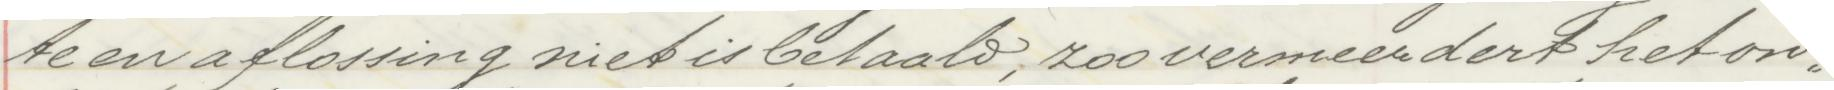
te en aflossing niet is betaald, zoo vermeerdert het on„
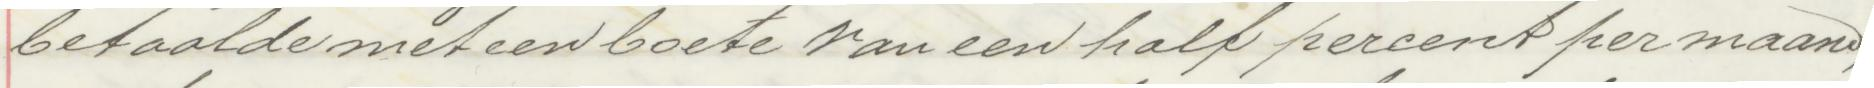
betaalde met een boete van een half percent per maand,
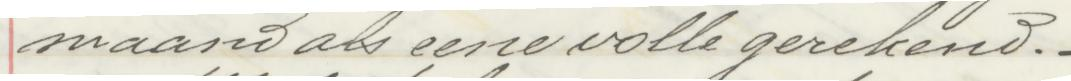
maand als eene volle gerekend.-
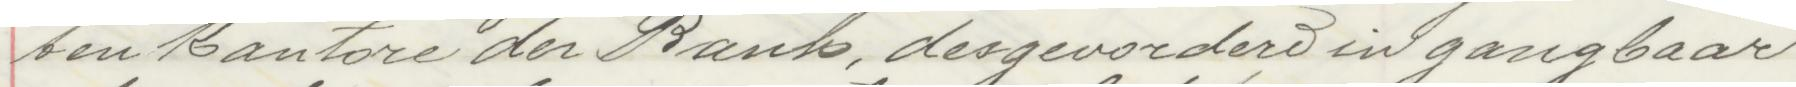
ten kantore der Bank, desgevorderd in gangbaar
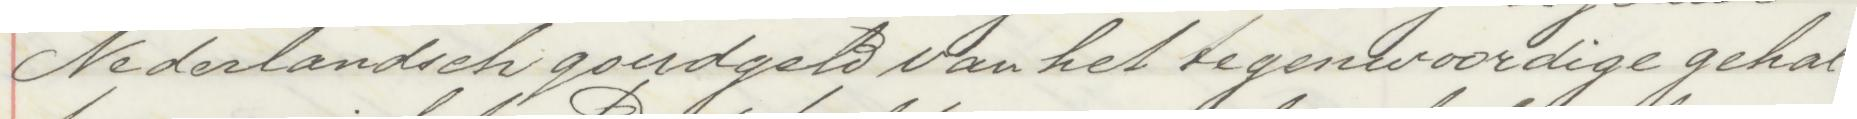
Nederlandsch goudgeld van het tegenwoordige gehal
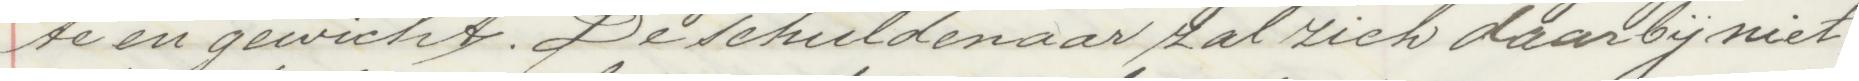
te en gewicht. De schuldenaar zal zich daar bij niet
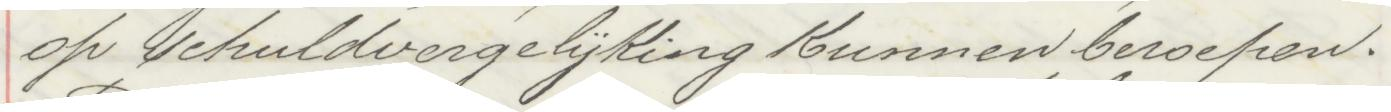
op schuldvergelijking kunnen beroepen.
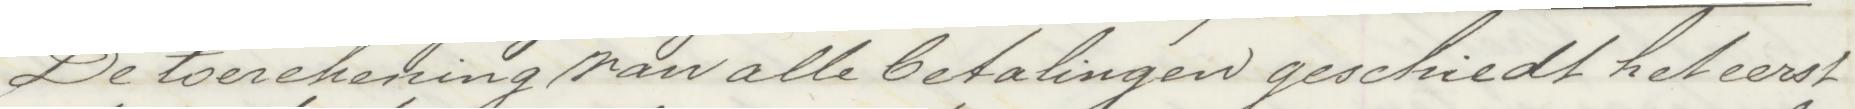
De toerekening van alle betalingen geschiedt het eerst
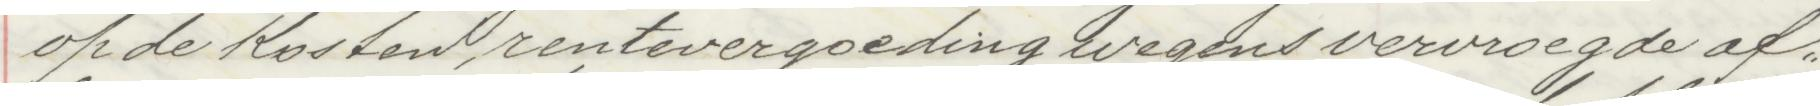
op de kosten, rentevergoeding wegens vervroegde af„
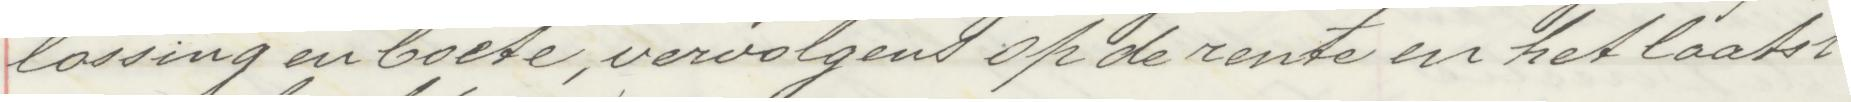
lossing en boete, vervolgens op de rente en het laatst
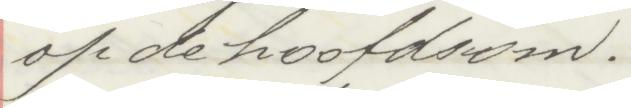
op de hoofdsom.
